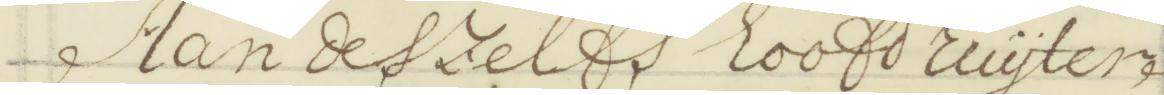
Aan deszelfs hoofd ruijter
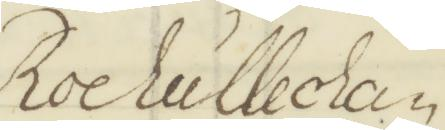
Roehullechan
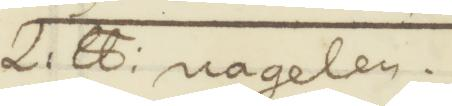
2: lb: nagelen -
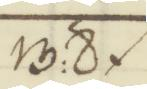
ƒ — 13:8ƒ
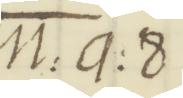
11:4:8
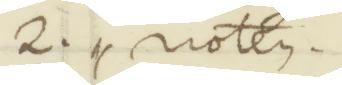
2. „ noten -
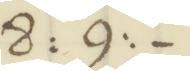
8: 9: –
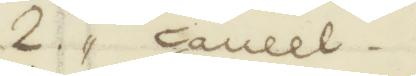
2. „ caneel -
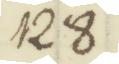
128
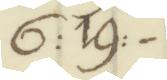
6: 19: –
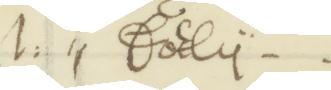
1: „ foelij -
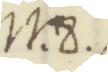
11.8.
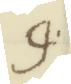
9: 9:
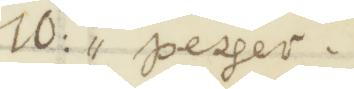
10: „ peper -
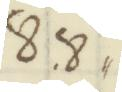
1. 8.8 „
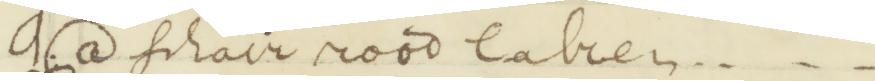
4. @ schair rood laken - - - -
